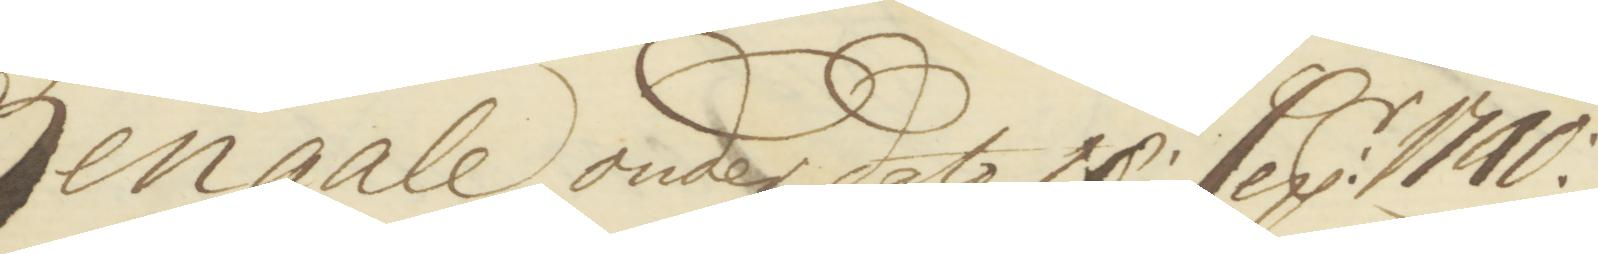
Van Bengale onder dato 18:' Sep:r 1740:
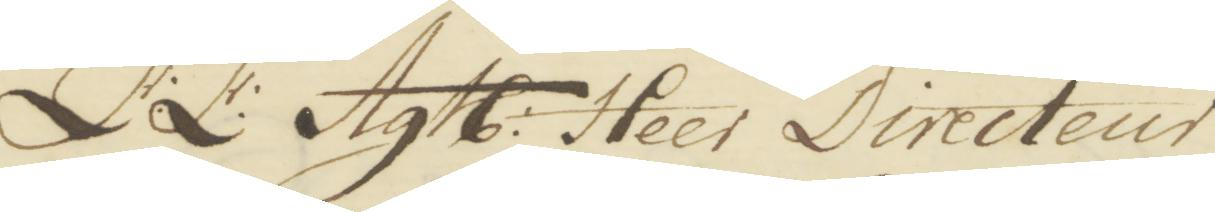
E:E: Agtb: Heer Directeur
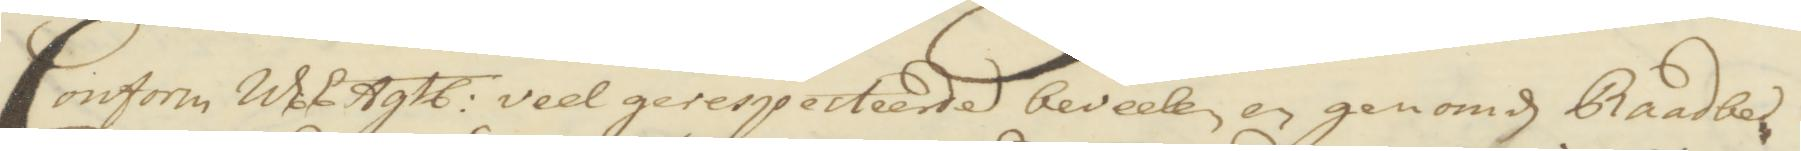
Conforn UEE Agtb: veel gerespecteerde beveelen en genomen Raadbe„
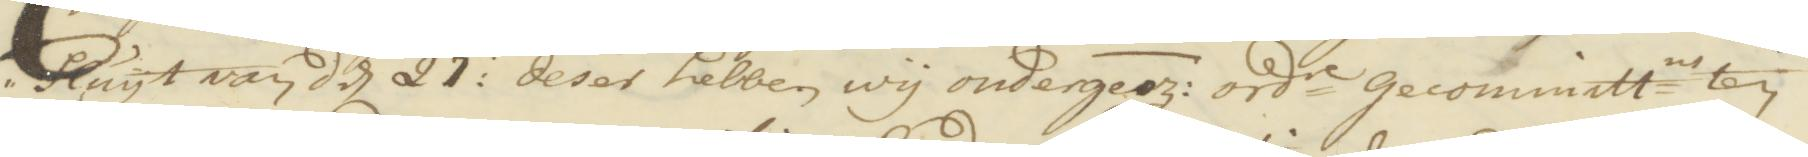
„sluijt van den 27:' deses hebben wij ondergesz: ord=re gecommitt=ns ten
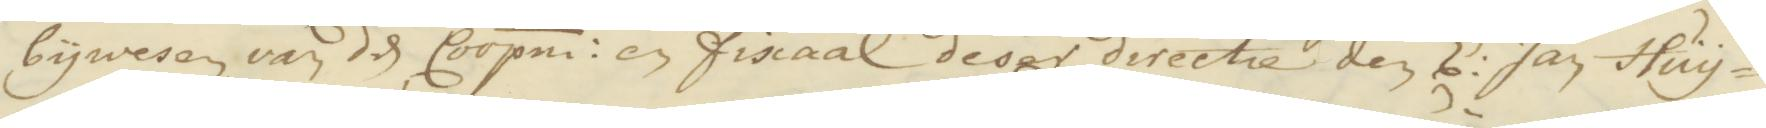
bijwesen van den Coopm: en fiscaal deses directie den E: Jan Huij=
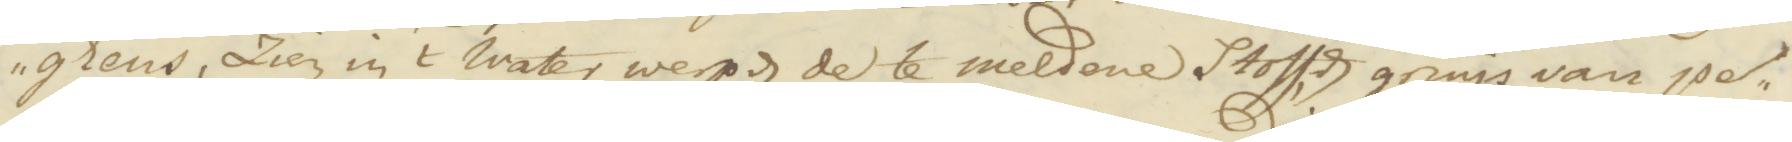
„ghens, zien in ’t water werpen de te meldene stoffen grijs van pe„
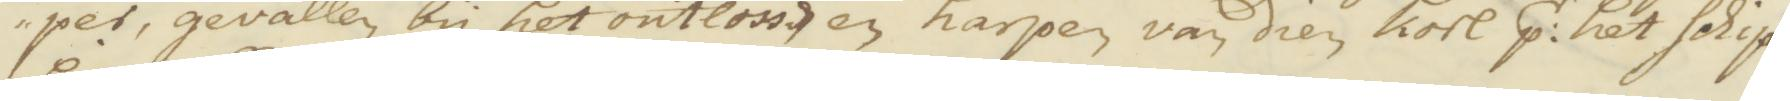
„per, gevallen bij het ontlossen en harpen van dien korl p:r het schip
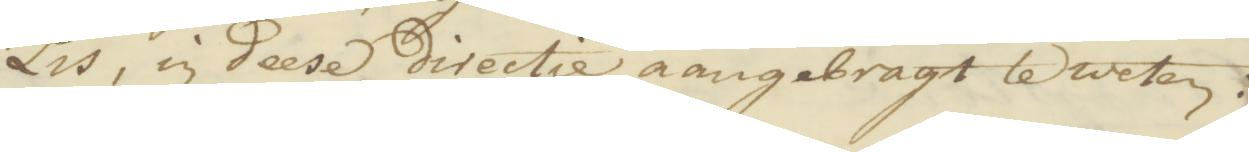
Lis, in deese directie aangebragt te weten:
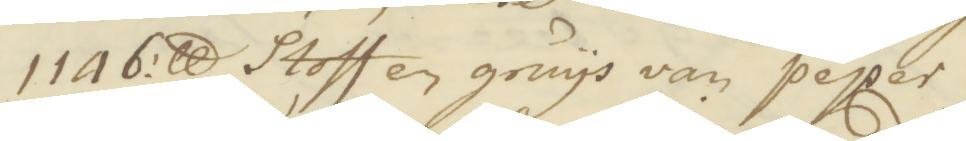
1146: lb stoff en gruijs van peper
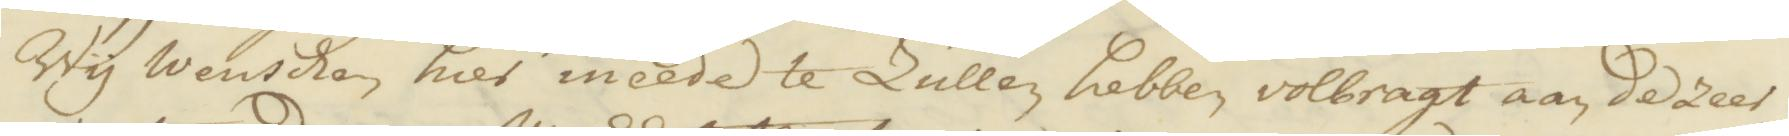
Wij wenschen hier meede te zullen hebben volbragt aan de zeer
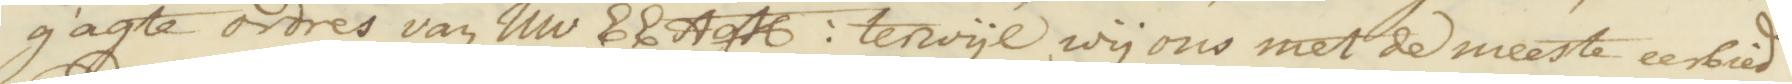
g’agte ordres van Uw EE Agtb: terwijl wij ons met de meeste eerbied
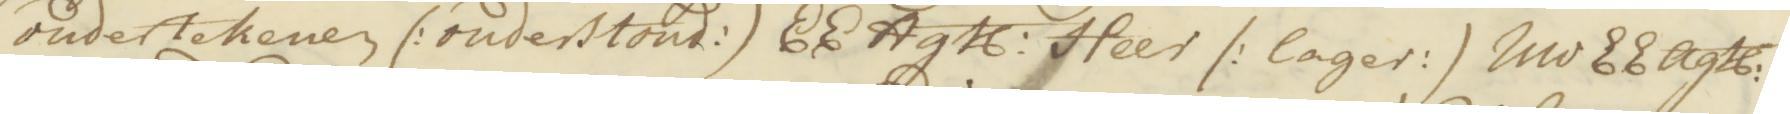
ondertekenen (:onderstond:) EE Agtb: Heer (:lager:) Uw EE Agtb:
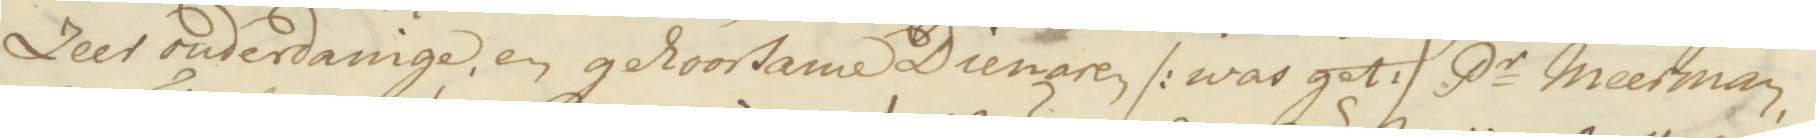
zeer onderdanige, en gehoorsame Dienaren /:was get:/ P=r Meerman,
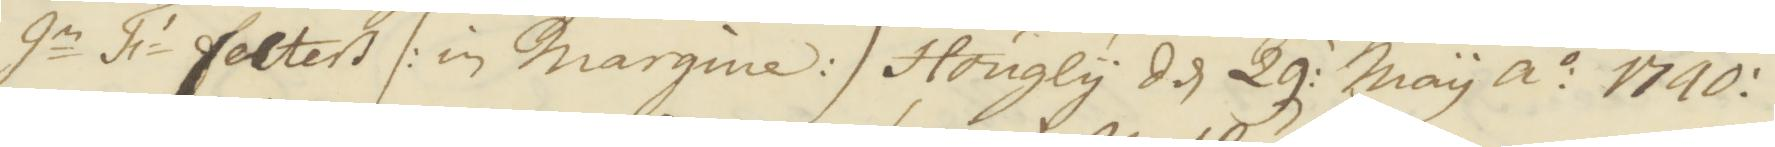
J=n F=s felters /:in Margine:/ Houglij den 29:' Maij a:o 1740:
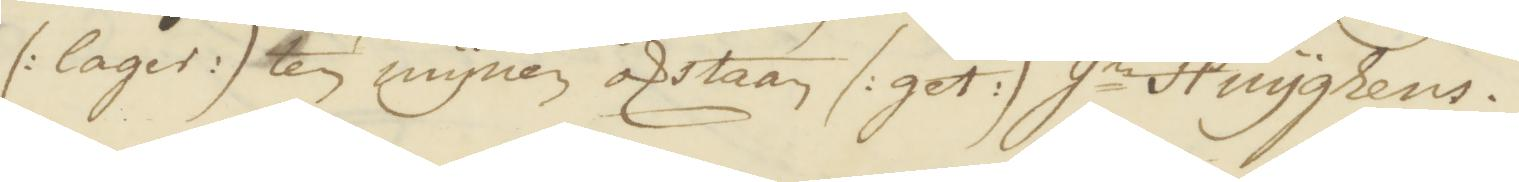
(:lager:) ten mijnen overstaan (:get:) J=n Huijghens.
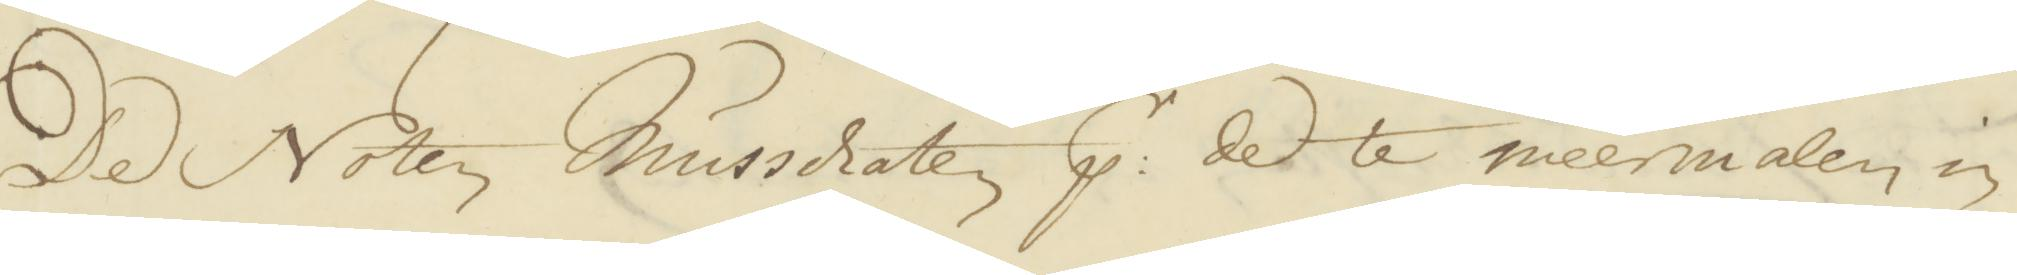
De Noten musschaten p:r de te meermalen in
